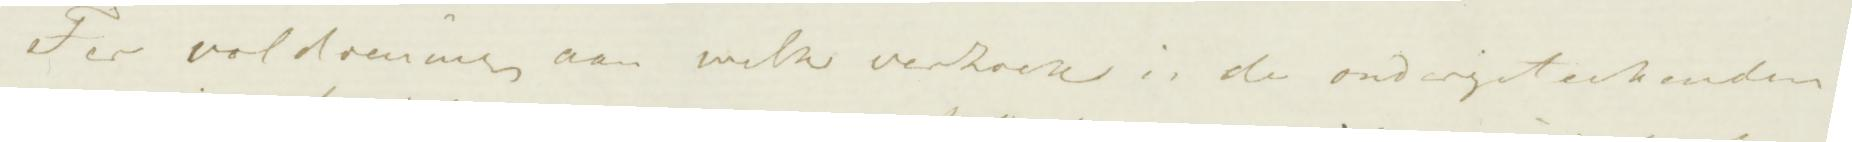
Ter voldoening aan welk verzoek is de ondergeteekenden
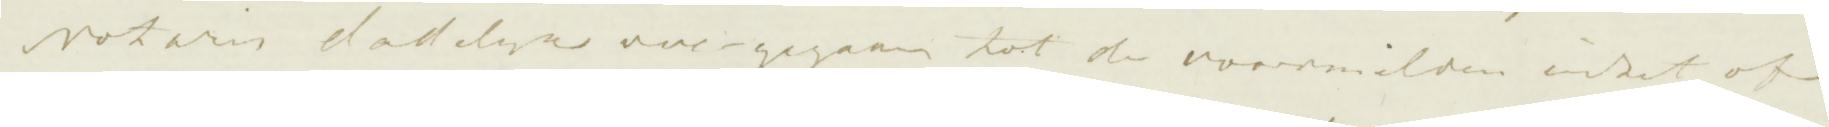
Notaris dadelyk overgegaan tot de voormelden inzet of
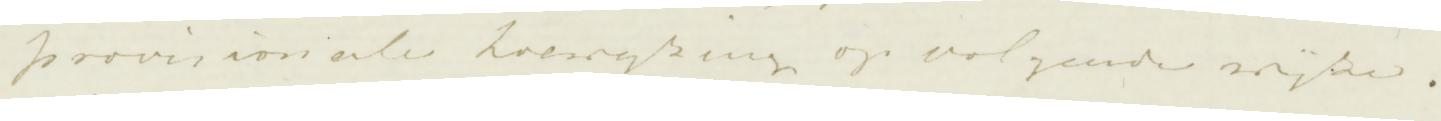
provisionele toewyzing op volgende wijze.
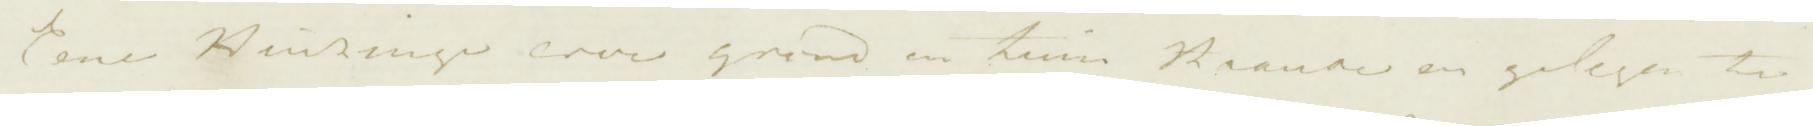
Eene Huizinge erve grond en tuin staande en gelegen te
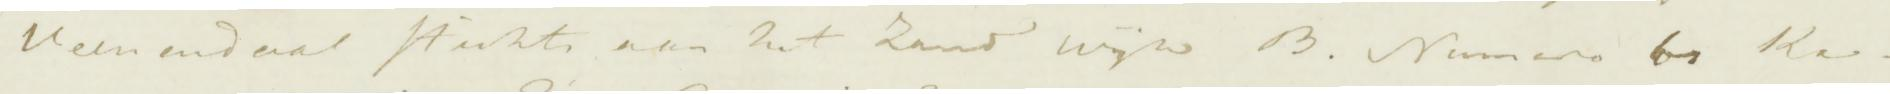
Veenendaal stichts aan het Zand wijk B. Numero 61 Ka
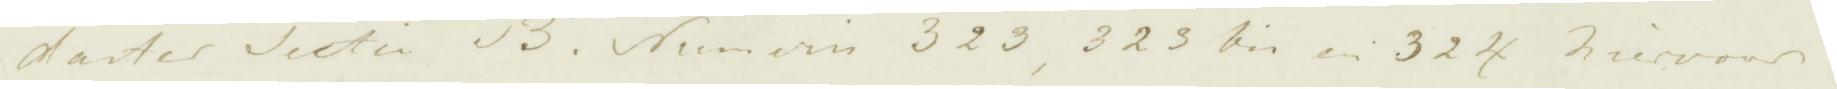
daster Sectie B. Numero 323, 323 bis en 324 hiervoor
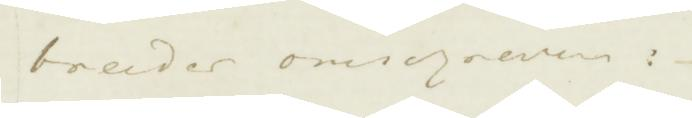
breeder omschreven:
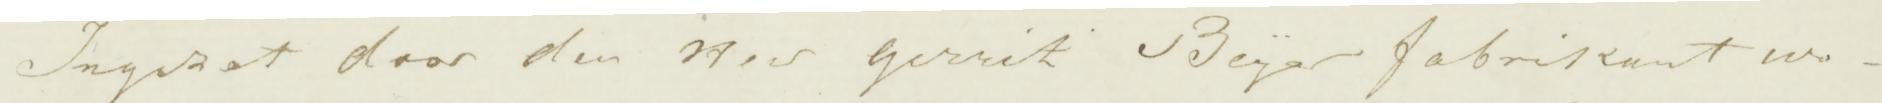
Ingezet door den Heer Gerrit Beijer fabrikant wo
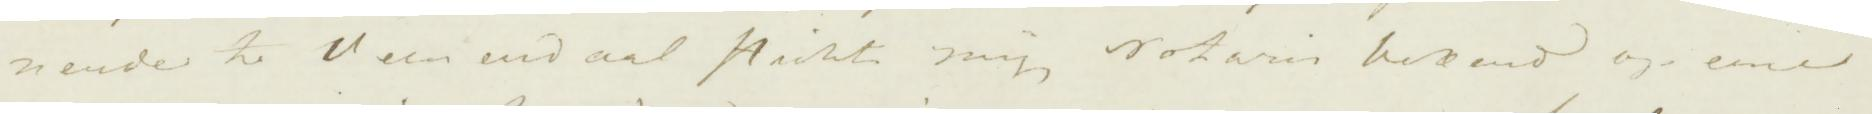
nende te Veenendaal sticht mij Notaris bekend op eene
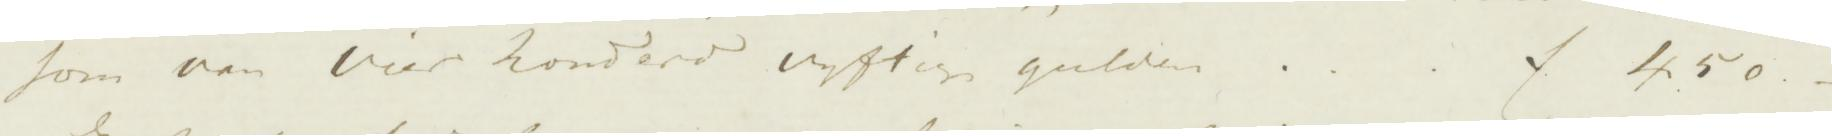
som van vier honderd vyftig gulden . . . ƒ. 450.
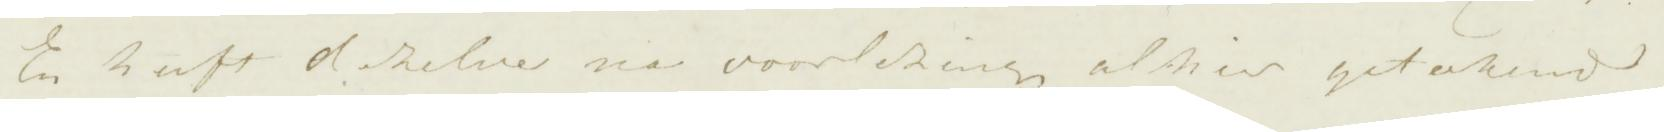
En heeft dezelve na voorlezing alhier geteekend
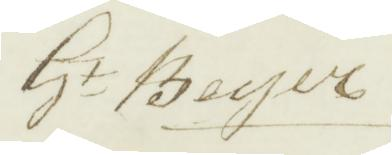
G:t Beyer
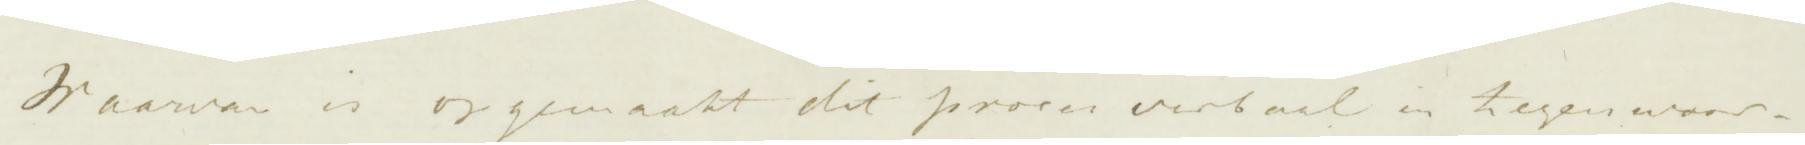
Waarvan is opgemaakt dit proces verbaal in tegenwoor=
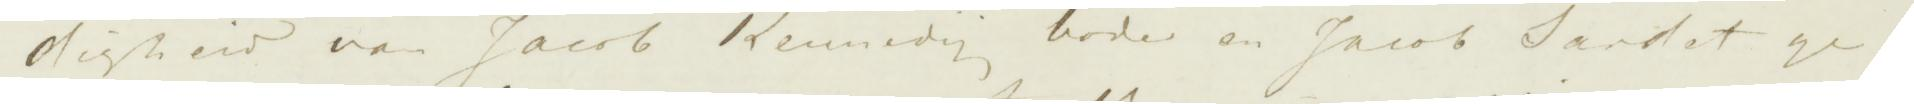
digheid van Jacob Kennedij bode en Jacob Sardet ge-
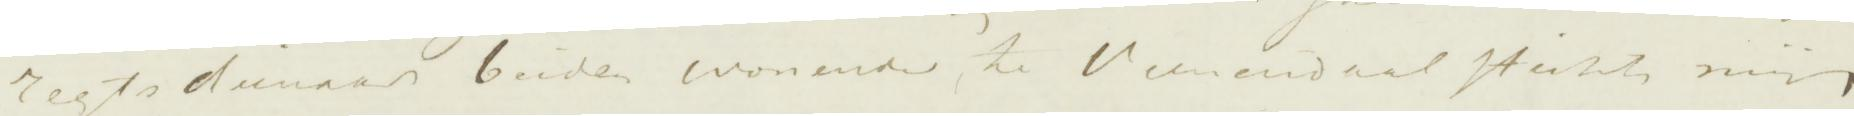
regts dienaar beiden wonende, te Veenendaal stichts mij
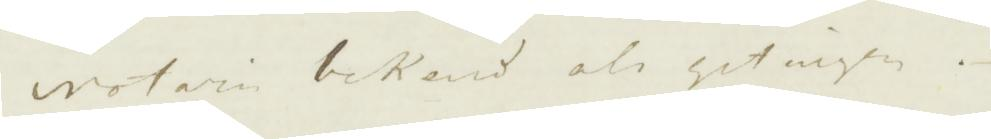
Notaris bekend als getuigen.
